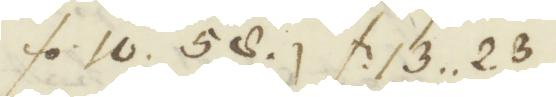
ƒ 10. 58. | ƒ. 13.. 23
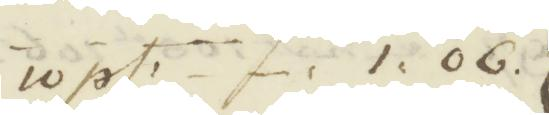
10 pC. - - . 1. 06.
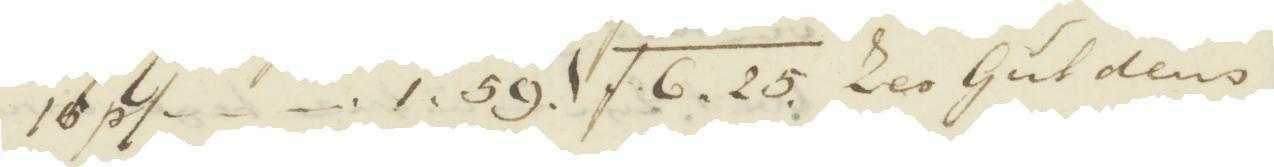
15 pC - - - . 1. 59 | ƒ. 6 .. 25. Zes Guldens
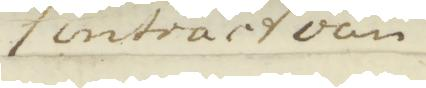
Contract van
